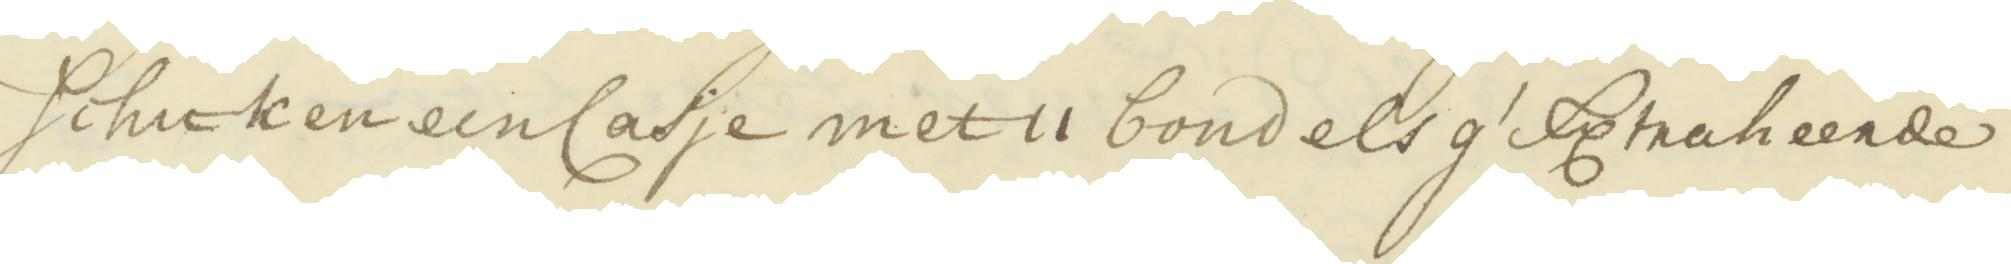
Schicken een Casje met 11 bondels g’ Extraheerde
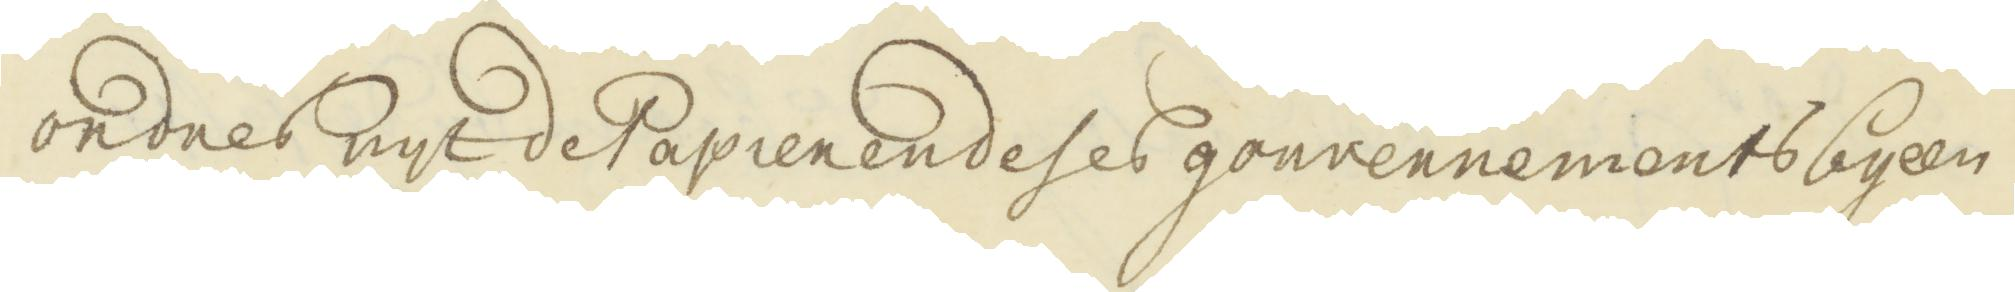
ordres uyt de Papieren deses gouvernements by een
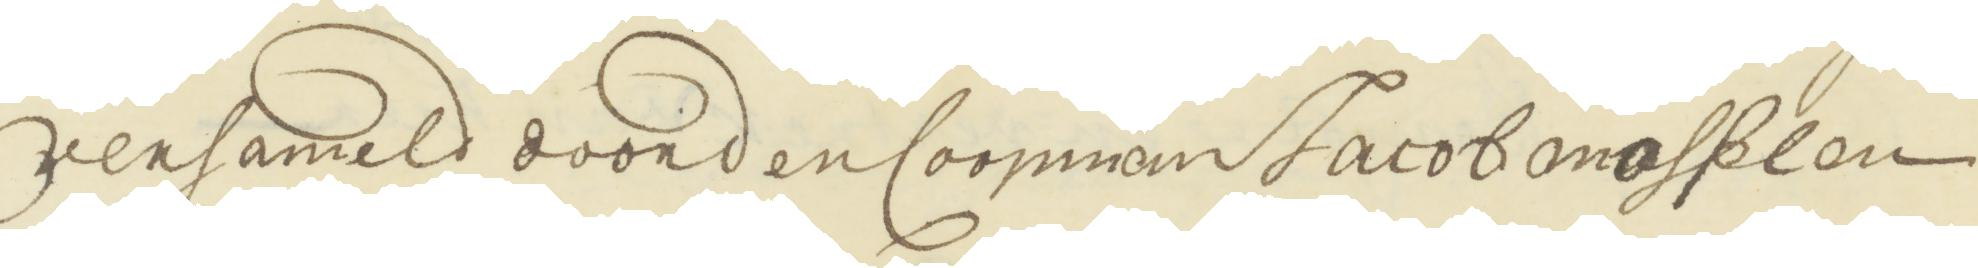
versameld door den Coopman Iacob mossel en
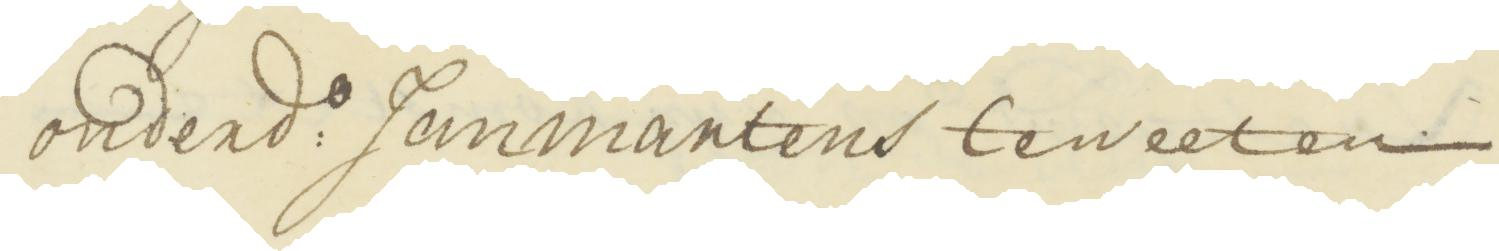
onder d:o Jan martens te weeten.
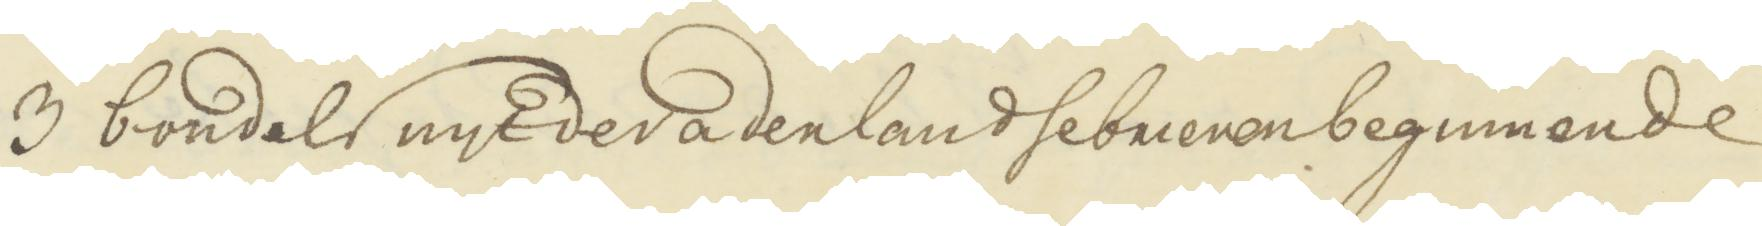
3 bondels uyt de vaderlandse brieven beginnende
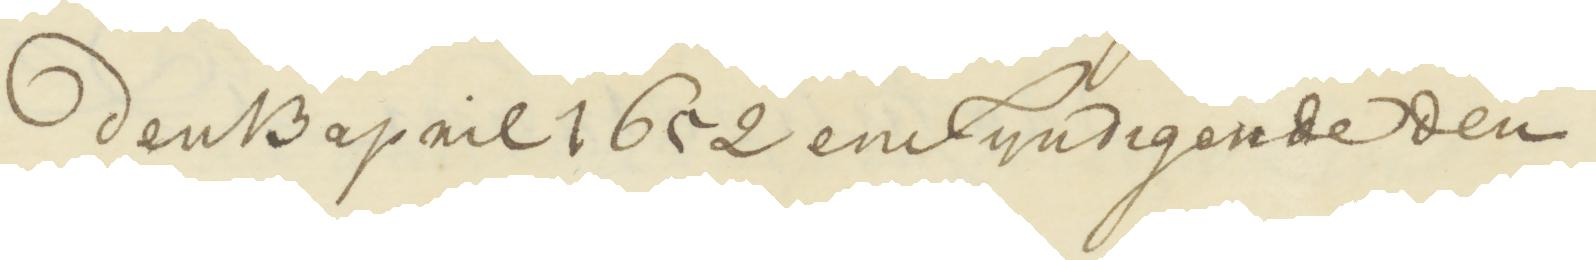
den 13 april 1652 en Eyndigende den
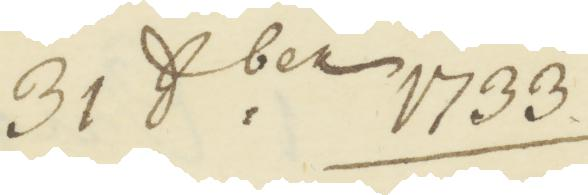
31 8„ber 1733
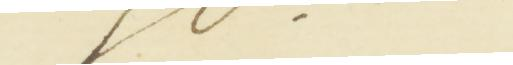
7 d=e
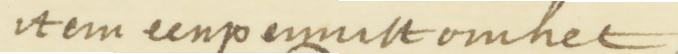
item eenpennist om het
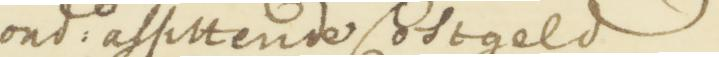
ord:e assistende Costgeld
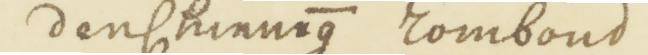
den Chirurg Romboud
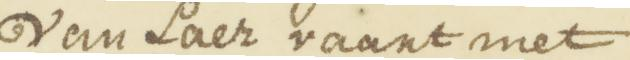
van Laer vaart met
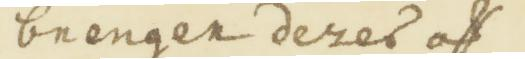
brenger dezes over
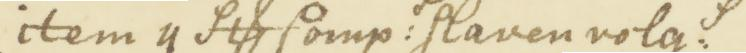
item 4 stx Comp:s slaven volg:s
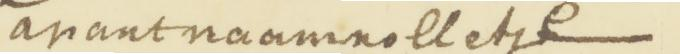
apart naamrolletje
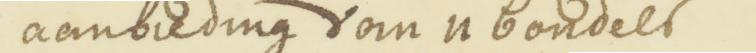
aanbieding van 11 bondels
